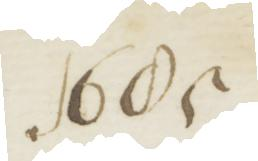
1685
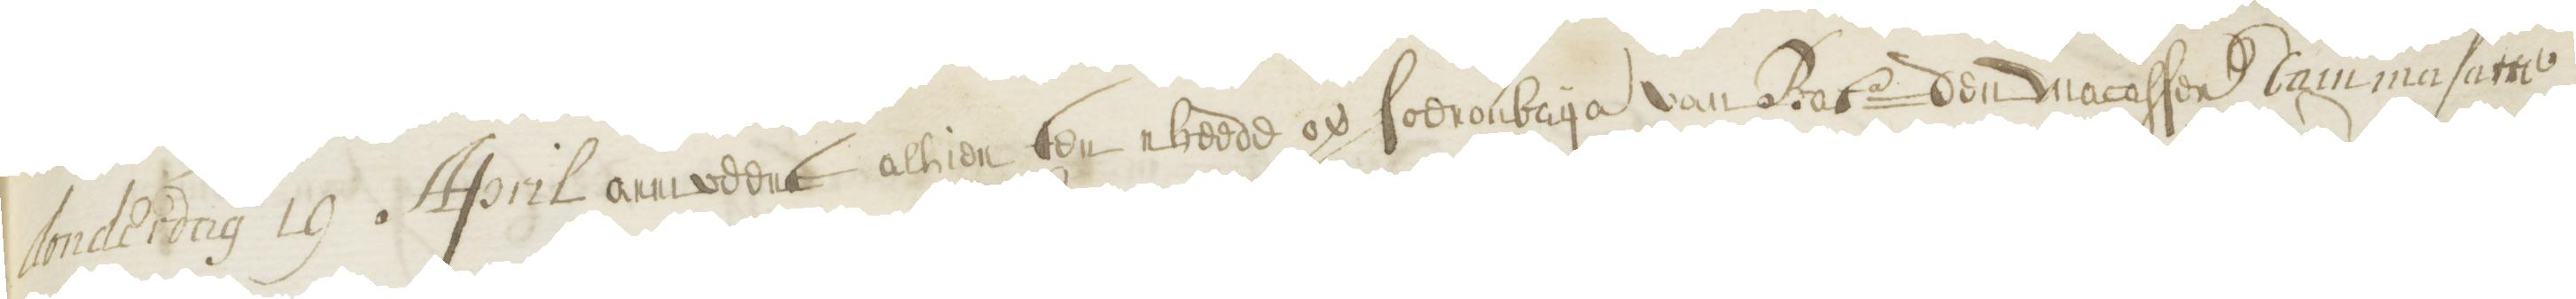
donderdag 19 April arriveert alhier ter rheede over soeroubaija van Bat=a den macasser dain masatte
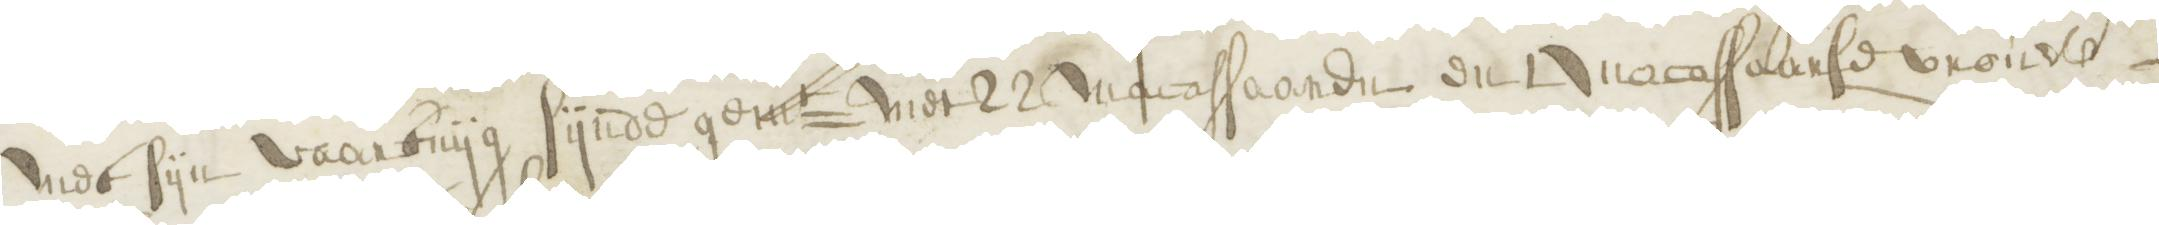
met sijn vaartuijg sijnde gem=t met 22 macassaaren en 1 macassaarse vrouwe
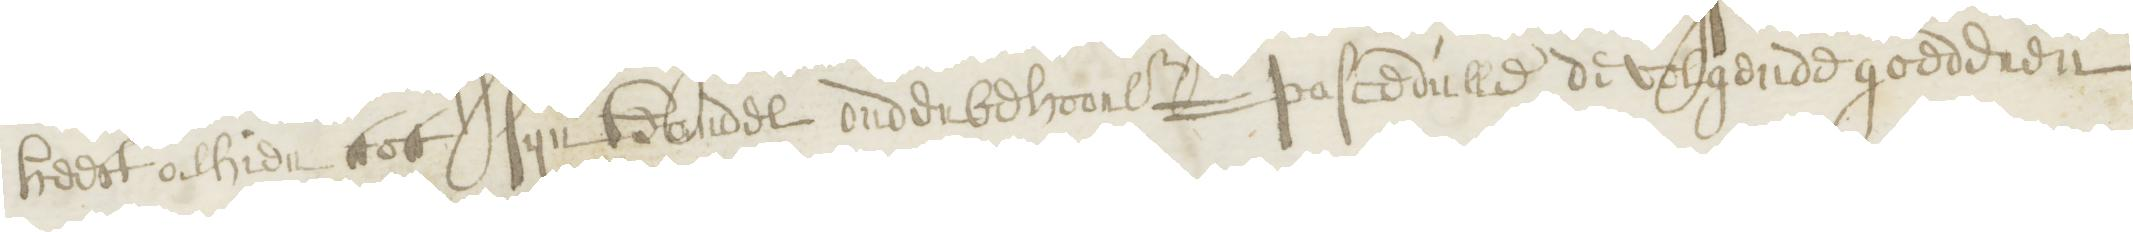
heeft alhier tot sijn handel onder behoorlijk pascedulle de volgende goederen
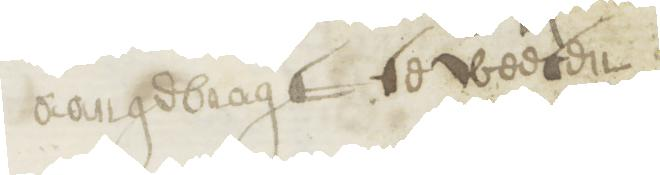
aangebragt te weeten
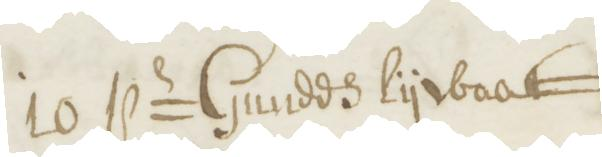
10 p=s Guneens lijwaat
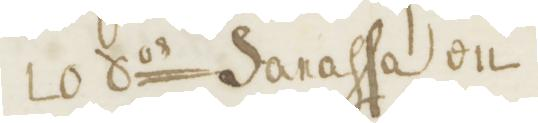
10 d=os Sarassa en
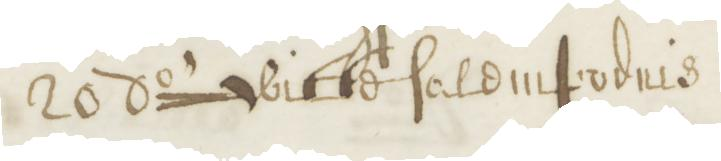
20 d=os witte salompodris
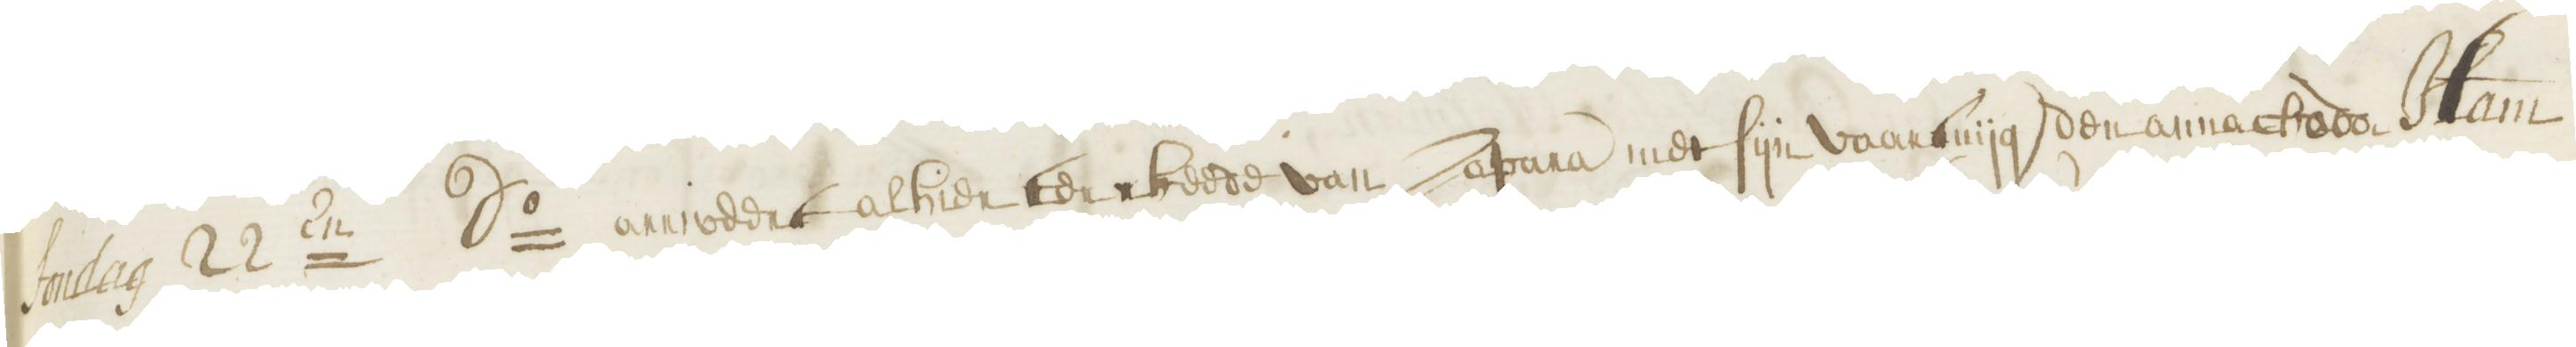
Sondag 22=en d=o arriveert alhier ter rheede van Japara met sijn vaartuijg den annachoda Itam
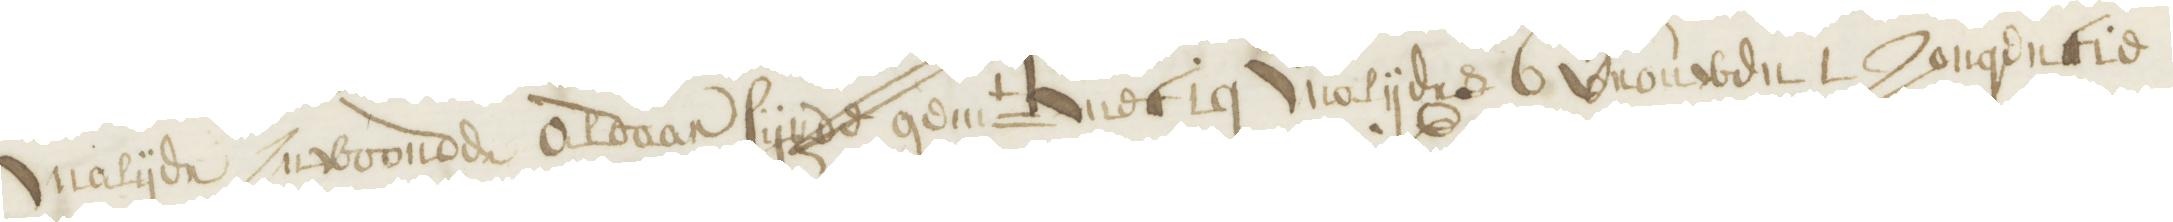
malijer jnwoonder aldaar sijnde gem=t met 19 malijers 6 vrouwen 1 jongentie
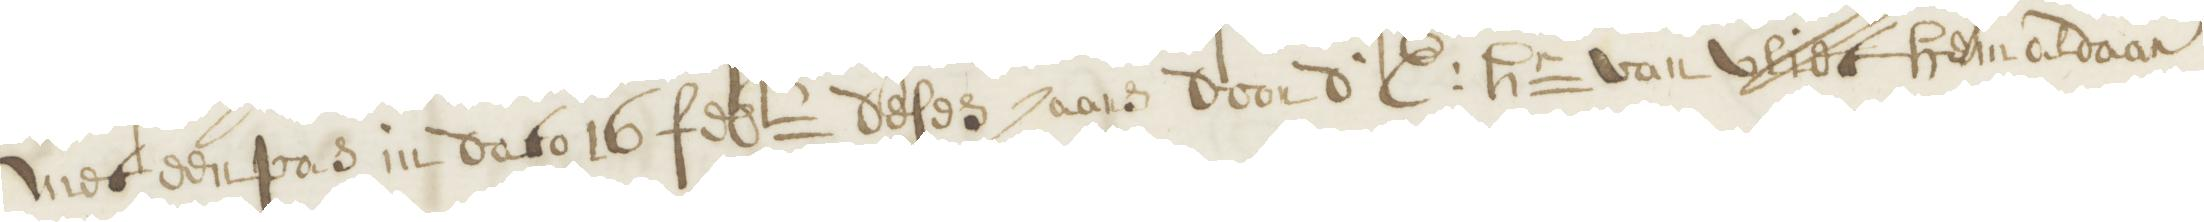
met een pas in dato 16 feb=' deses jaars door d’ E: h=r van vliet hem aldaar
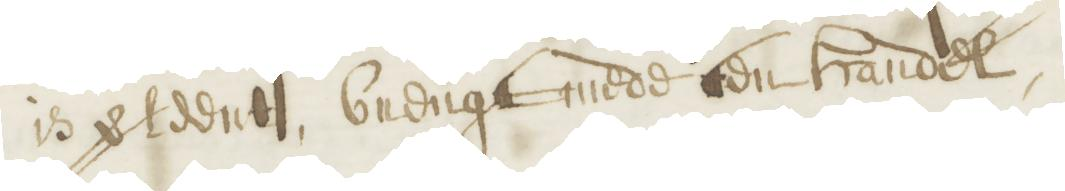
is verleent, brengt mede ten handel,
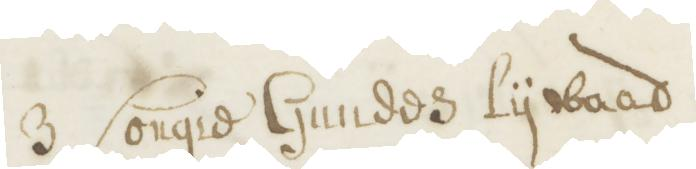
3 Corgie Gunees lijwaad
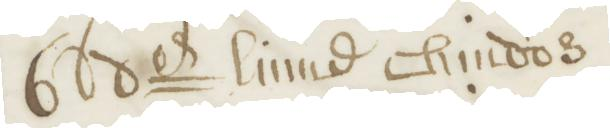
6 d=os linne chindos
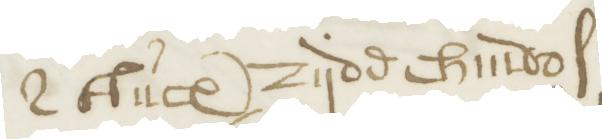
2 stucx zijde chindos
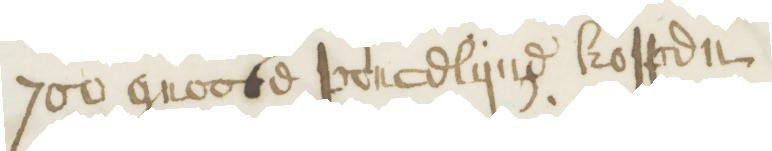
700 groote porcelijne koppen
